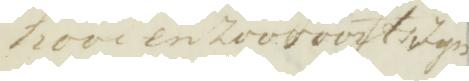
hooi en zoovoorts, zyn
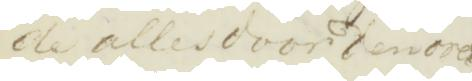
de alles door den over
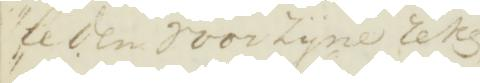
„leden voor zijne reke
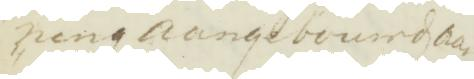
„ning aangebouwd aan
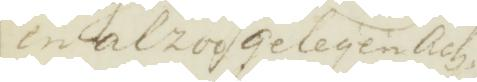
en alzoo gelegen Ach
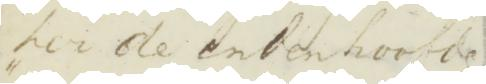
„ter de indenhoofde
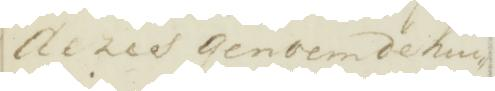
dezes genoemde hui
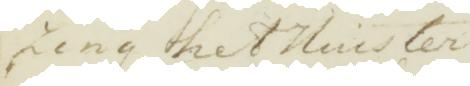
zing het Huis ter
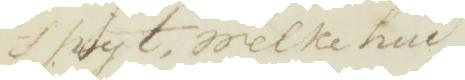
spyt, welke hui
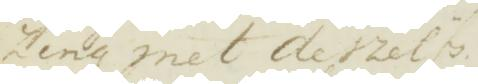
zing met des elfs
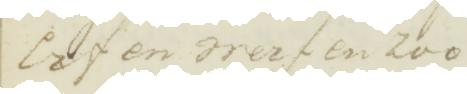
Erf en werf en zoo
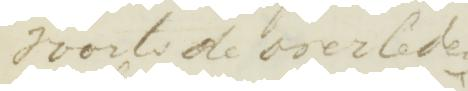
voorts de overlede
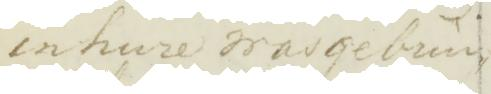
in hure was gebrui
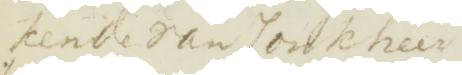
kende van Jonkheer
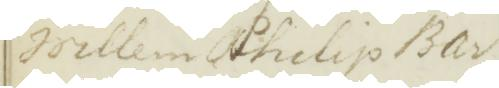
Willem Philip Bar
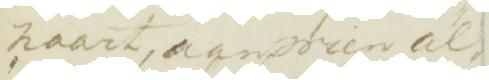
naart, aan wien al„
